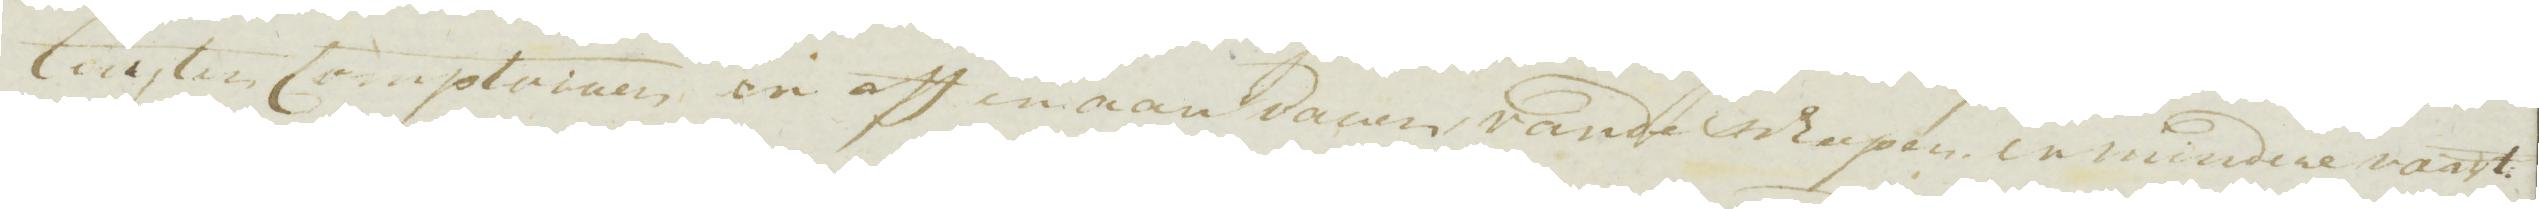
buijten comptoiren en off en aan varen vande scheepen en mindere vaart„
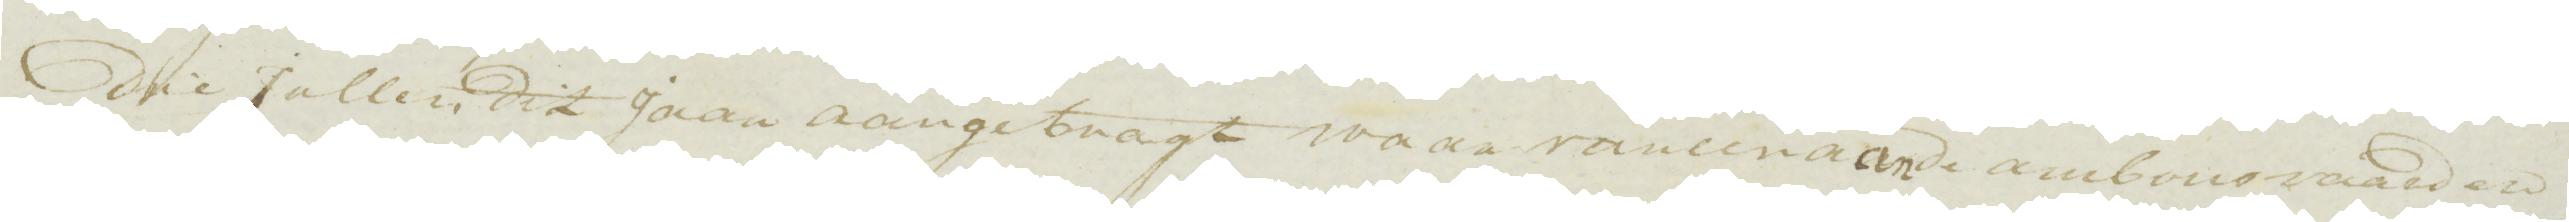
drie Jollen dit jaar aangebragt waar van een aande ambons vaard is
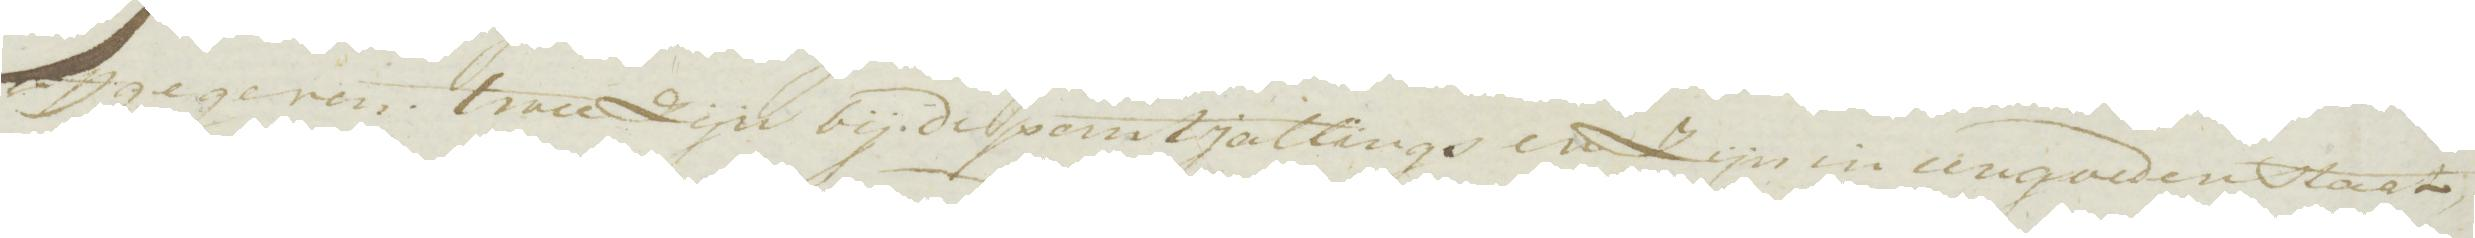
affgegeven twee zijn bij de pantjallings en zijn in een goeden staat,
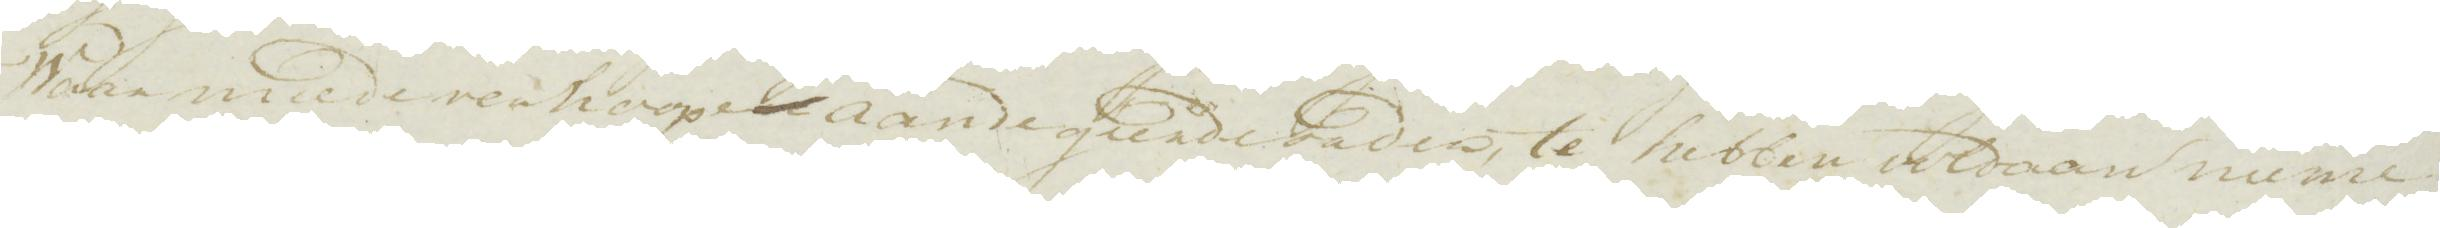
Waar meede verhoopen aande g'eerde orders, te hebben voldaan neeme
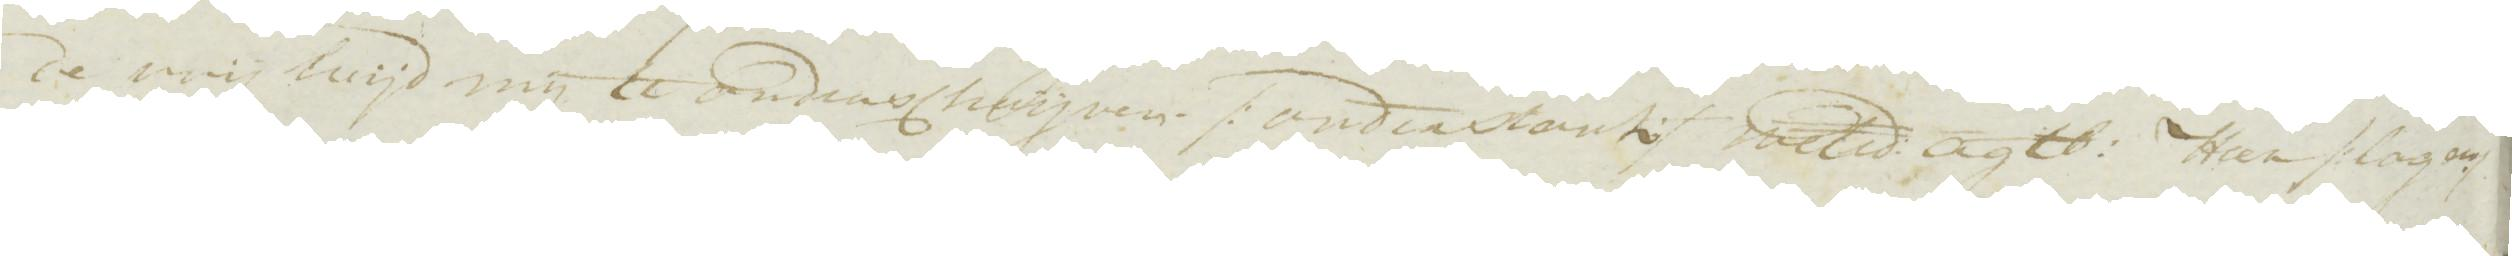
de vrij heijd mij te onderschrijven /:onderstont:/ weled: agtb: Heer /:lager:/
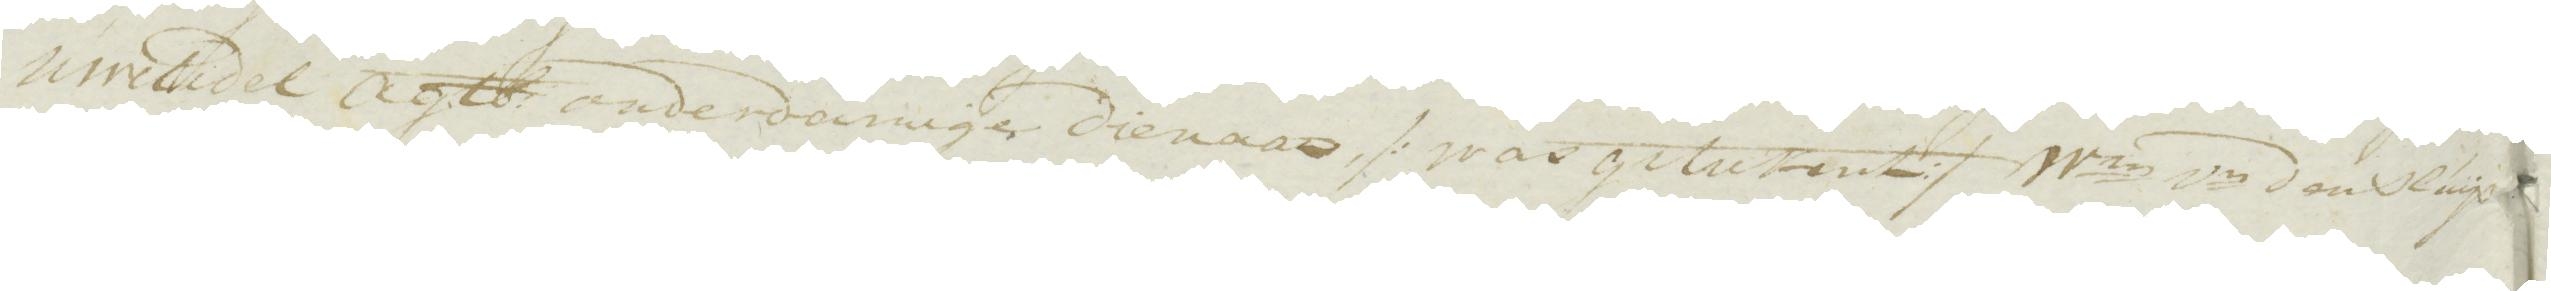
uweledel agtb: onderdanigen dienaar, /:was getekent:/ w=m v=n densluijs
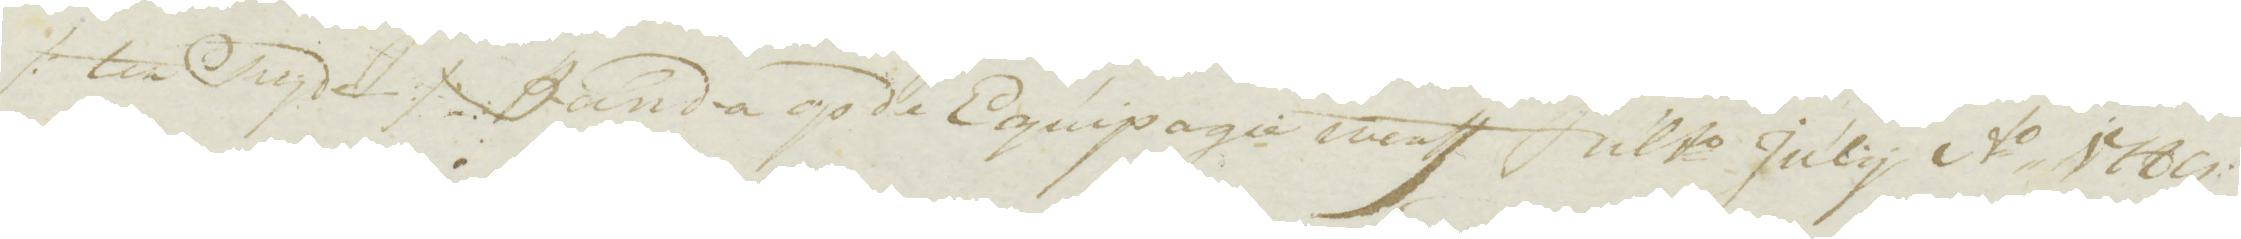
/:ter seijde:/ Banda op de Equipagie werff ult=o Julij A„o 1789:
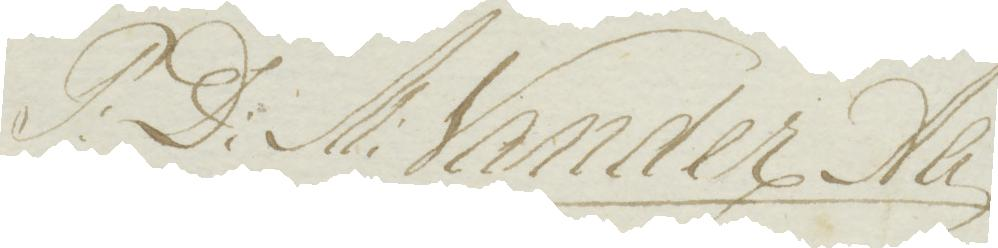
P: D: M: Van der Aa
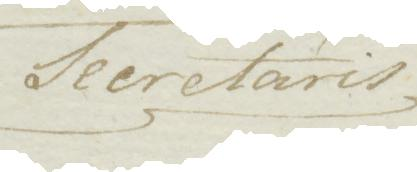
secretaris
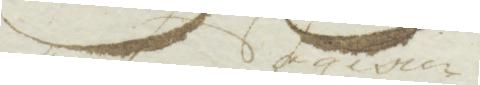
Nageseer
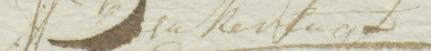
Pherkemagt
